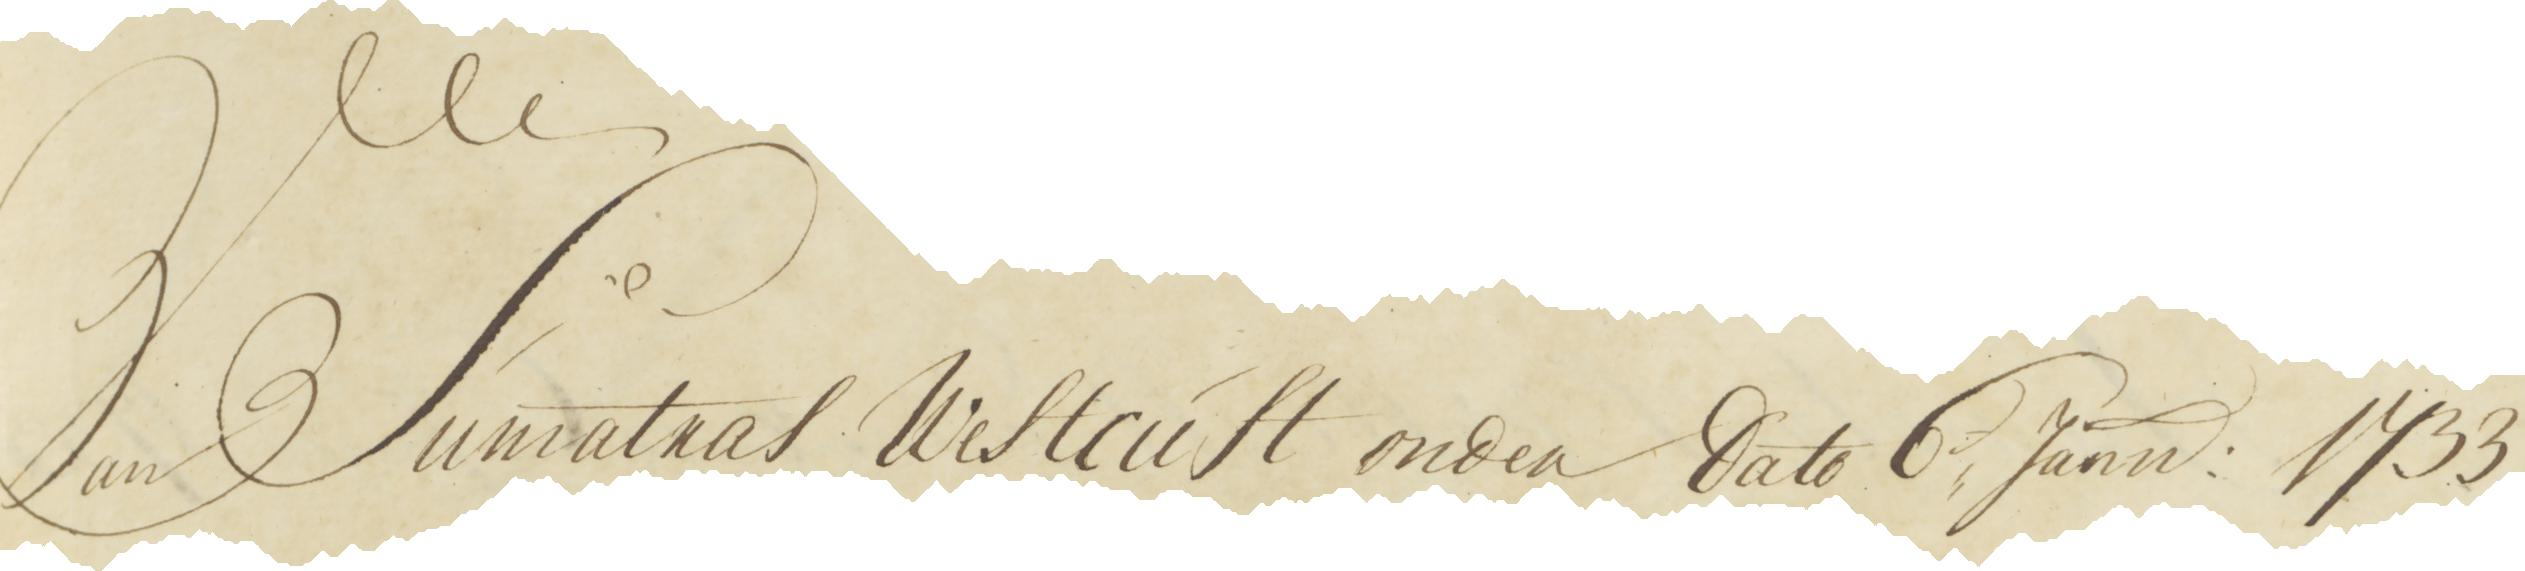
Van Sumatras Westcust onder dato 6„ Jann: 1733
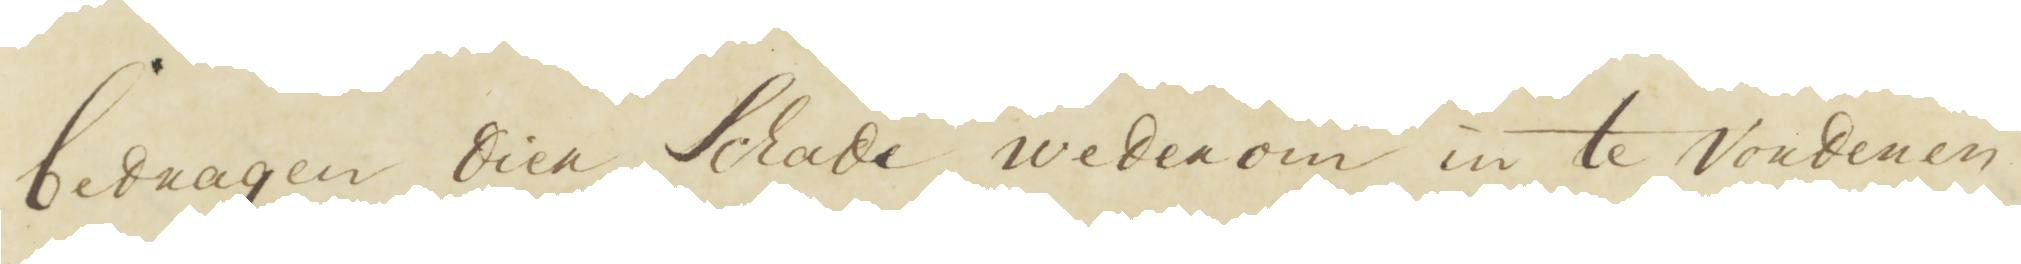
bedragen dier schade wederom in te vorderen
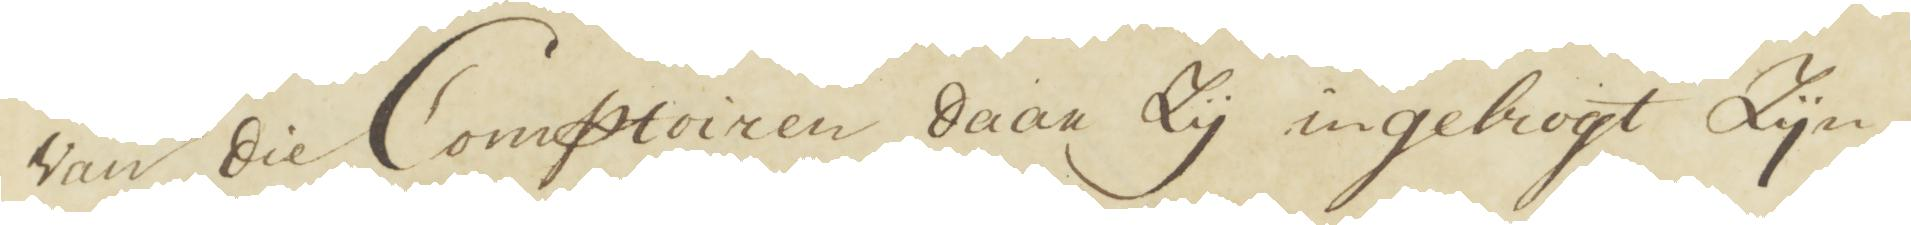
van die Comptoiren daar zij ingekogt zijn,
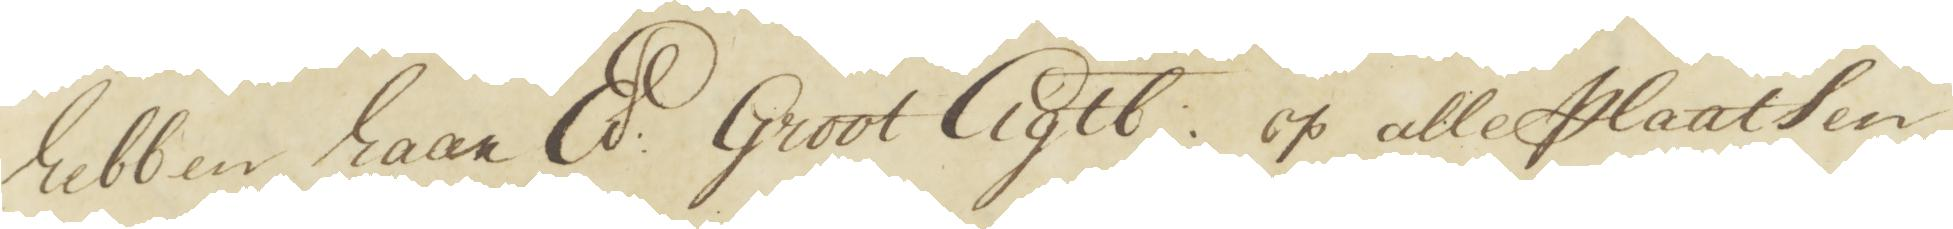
hebben haar Ed: Groot Agtb: op alle plaatsen
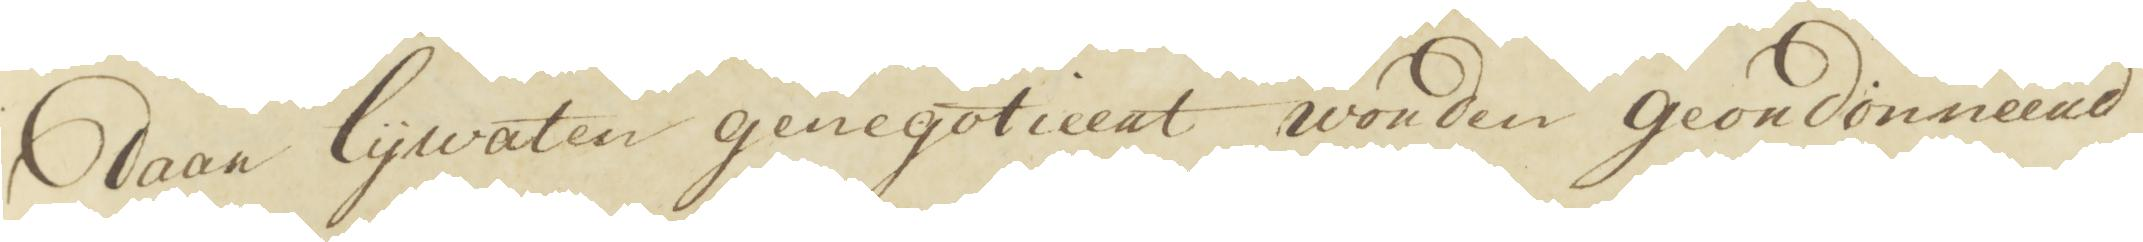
daar lijwaten genegotieert worden geordonneerd
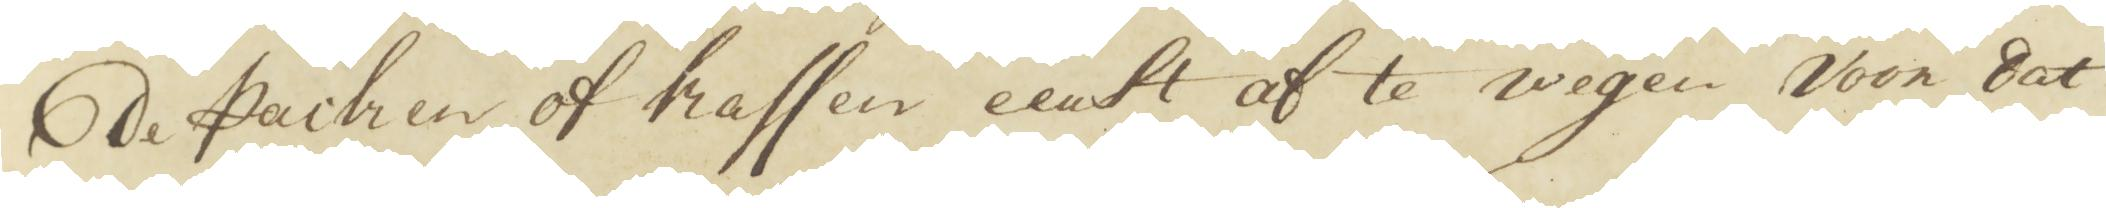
de packen of kassen eerst af te wegen voor dat
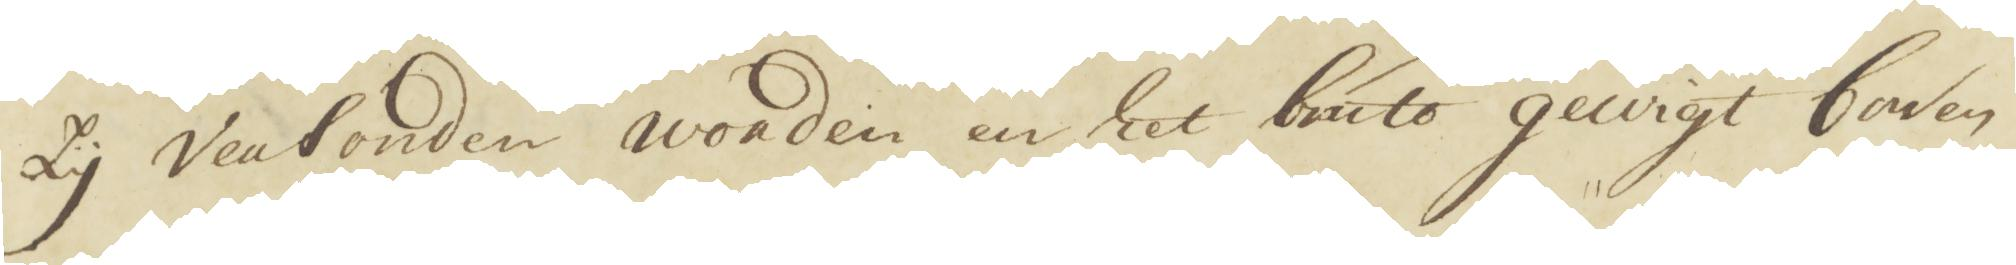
zij versonden worden en het bruto gewigt boven
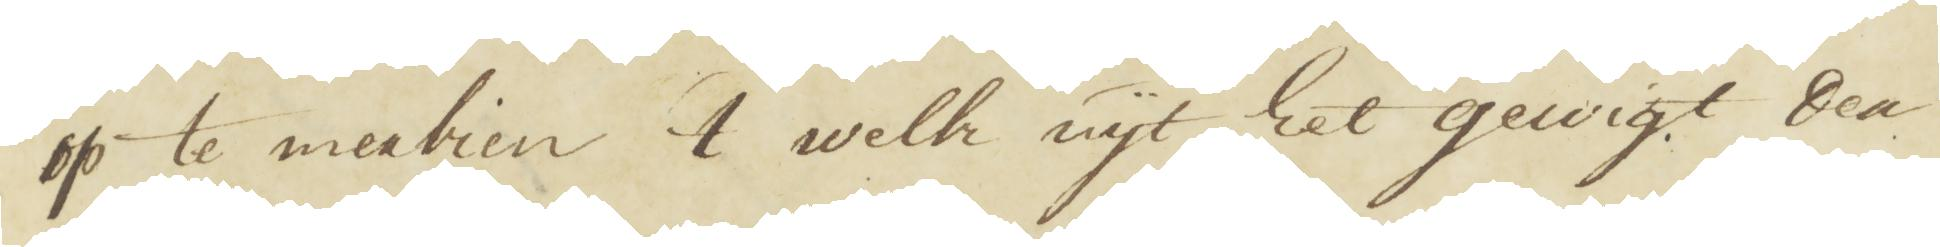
op te merken ’t welk uijt het gewigt der
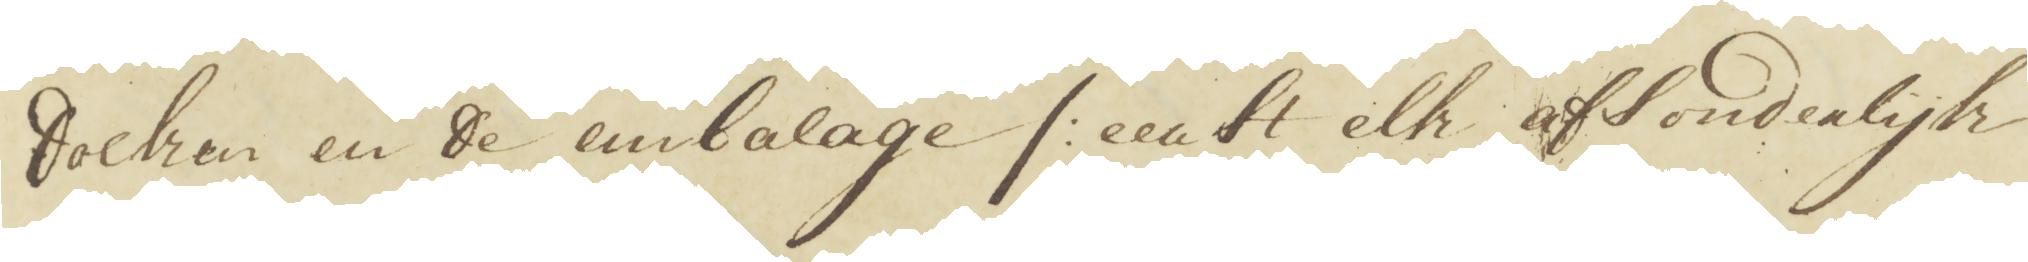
doeken en de embalage /: eerst elk afsonderlijk
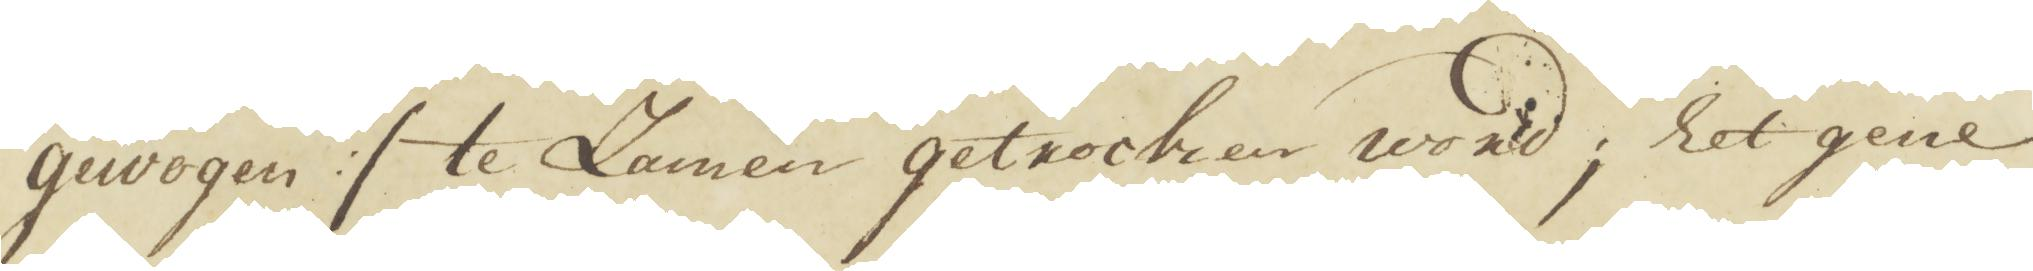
gewogen :/ te zamen getrocken word; het gene
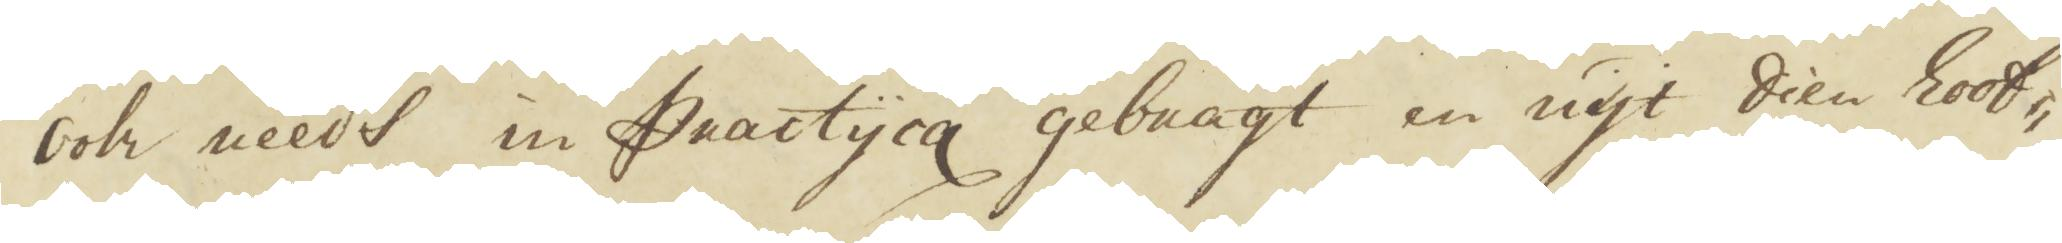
ook reeds in practijcq gebragt en uijt dien hoof„
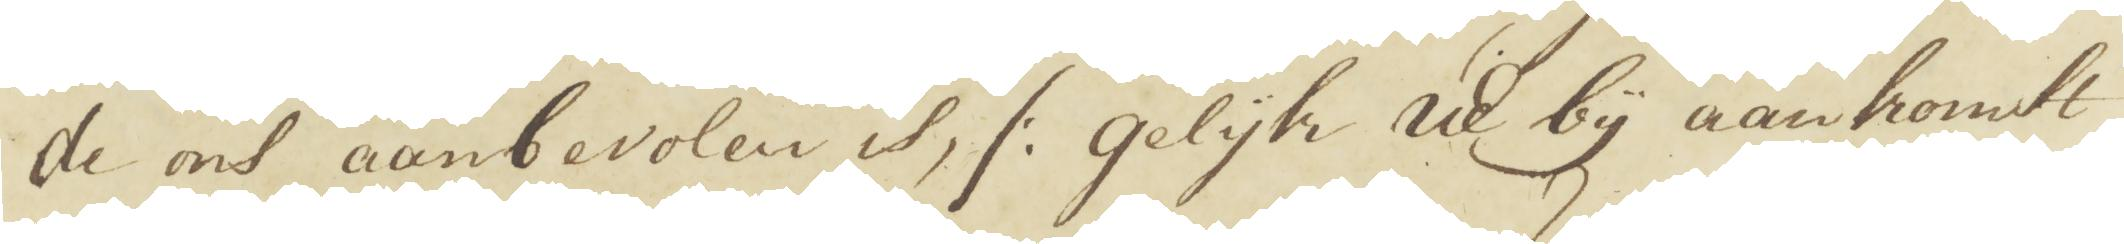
de ons aanbevolen is, /: gelijk uE bij aankomst
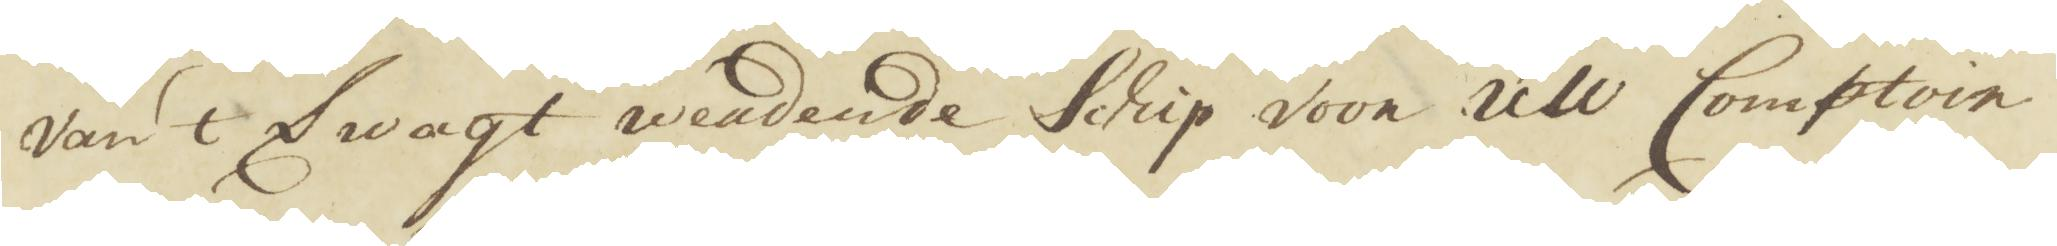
van ’t verwagt werdende schip voor uw Comptoir
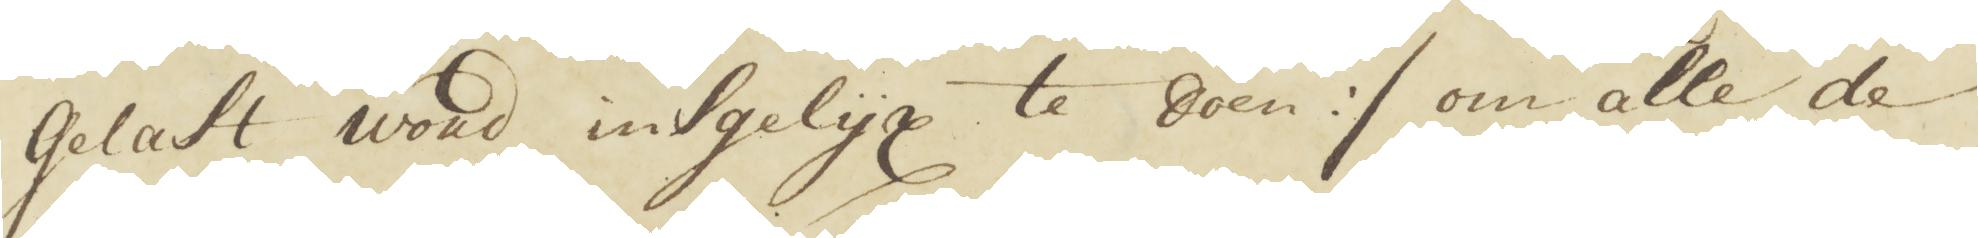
gelast word insgelijx te doen :/ om alle de
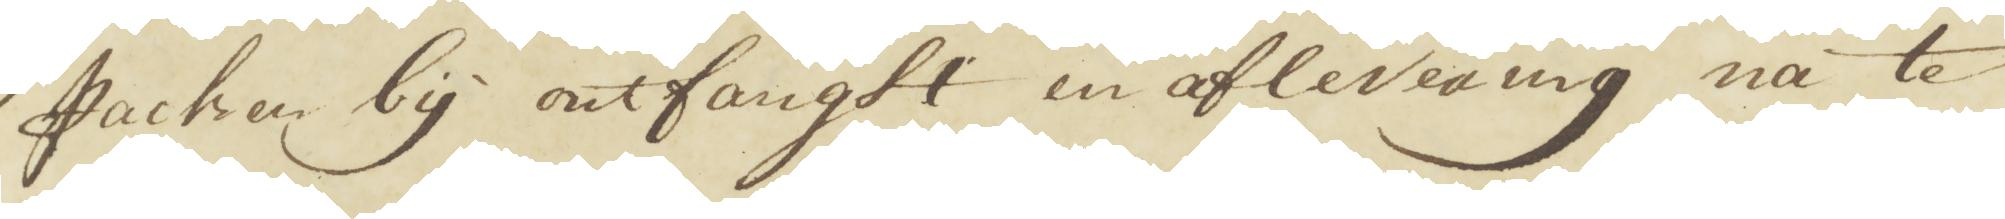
packen bij ontfangst en aflevering na te
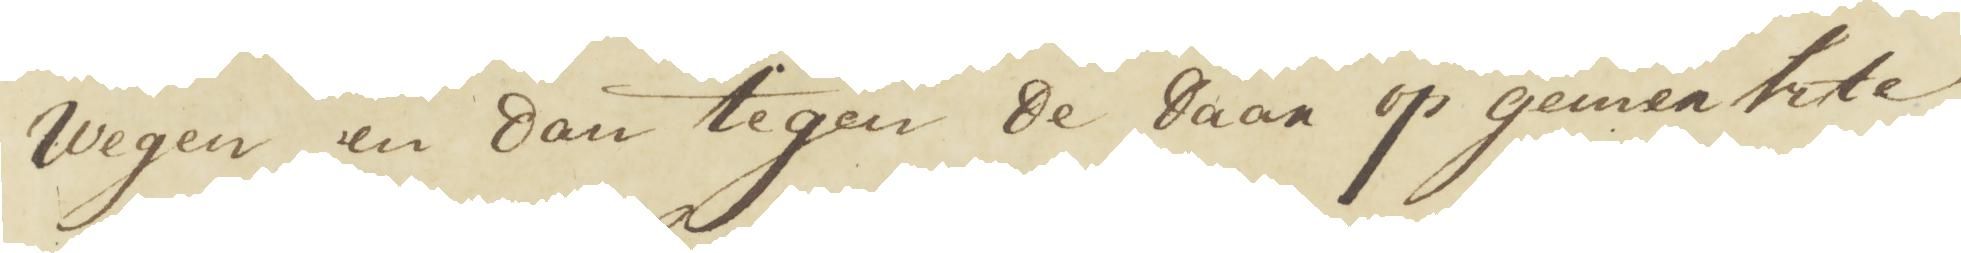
wegen en dan tegen de daar op gemerkte
